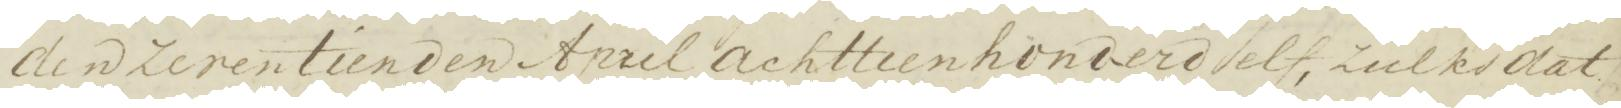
den Zeventienden April achttienhonderd elf, zulks dat
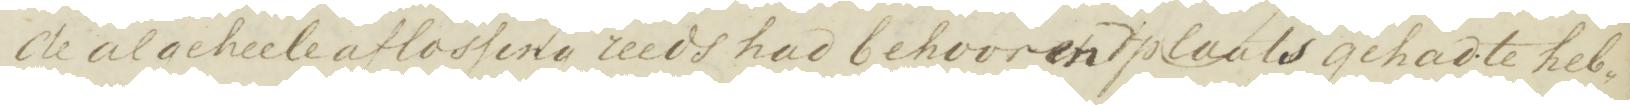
de algeheele aflossing reeds had behooren plaats gehad te heb„
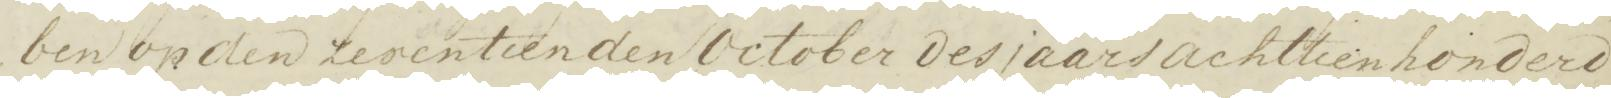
ben op den zeventienden October des jaars achttien honderd
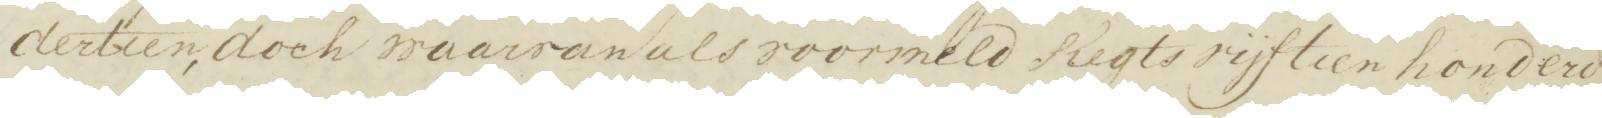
dertien, doch waarvan als voormeld Regts vijftien honderd
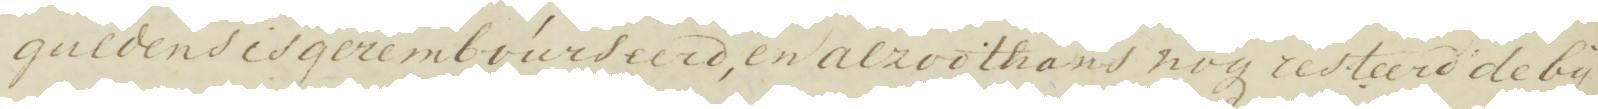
guldens is gerembourseerd, en alzoo thans nog resteerd de bij
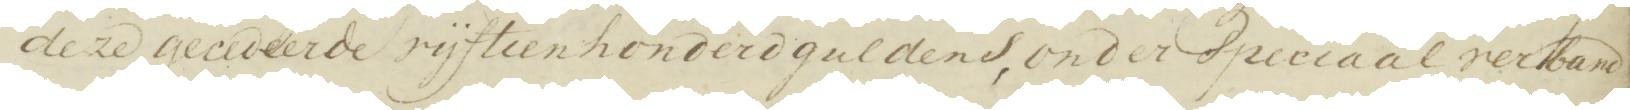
deze gecedeerde vijftien honderd guldens, onder speciaal verband
